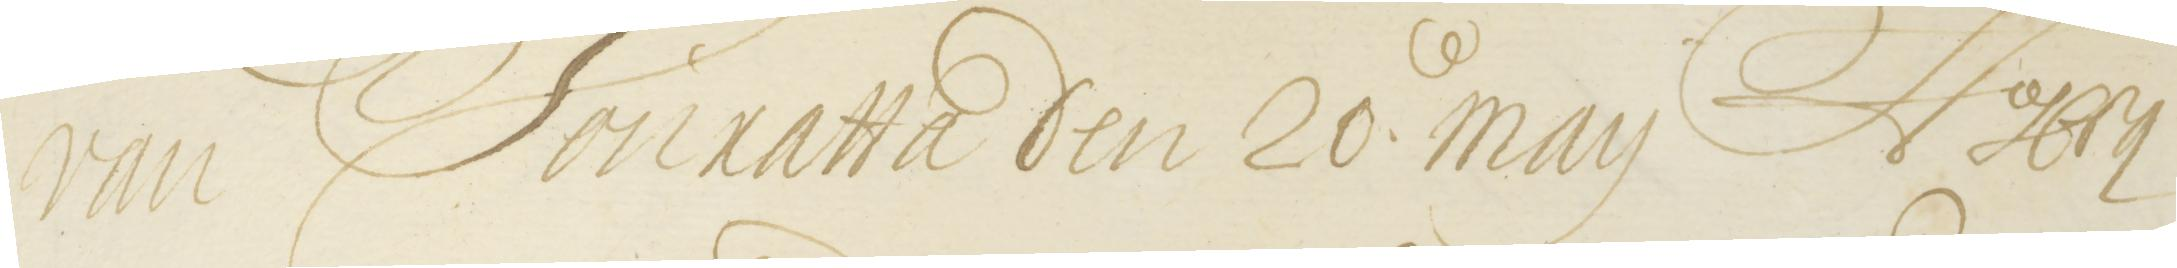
Van Souratta den 20.e maij Ao1684
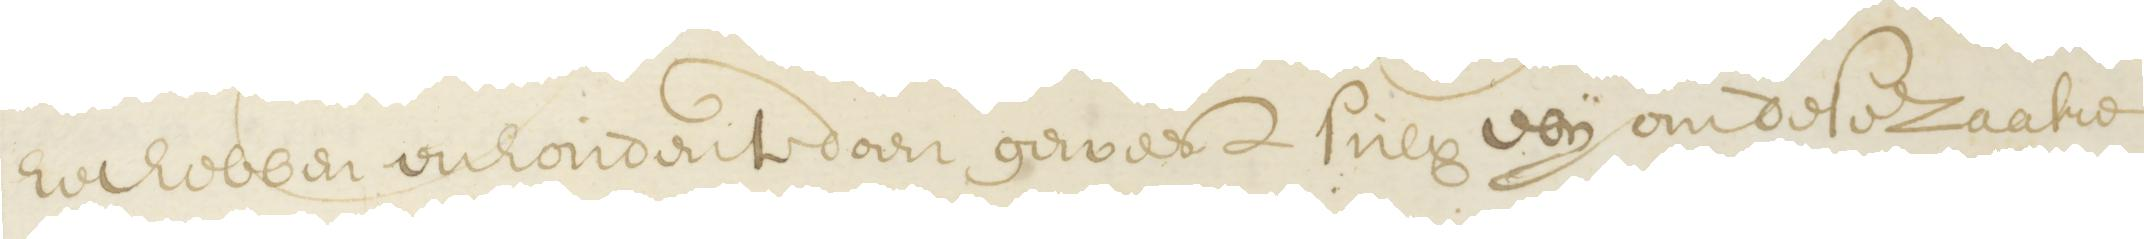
het hebben enhouden te doen geweest sulx wij om desezaake
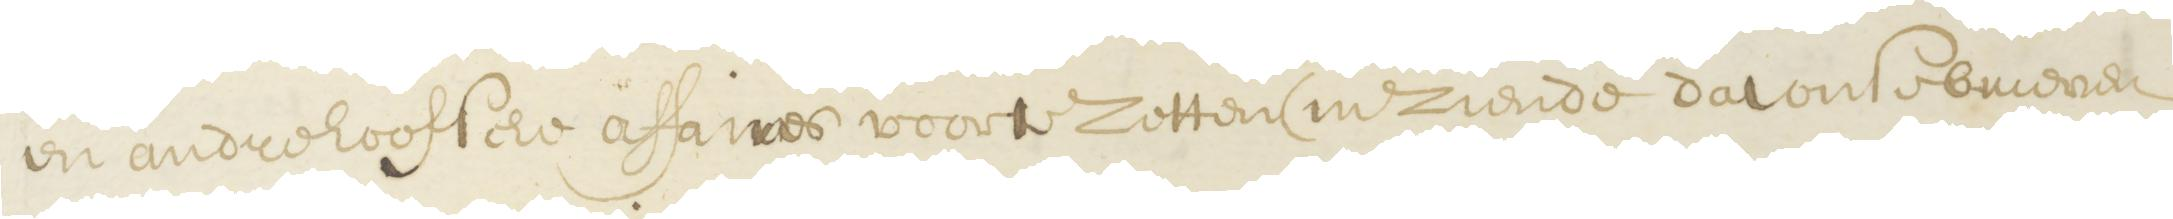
en andrehoofsche affaires voor te zetten (inziende dat onse brieven
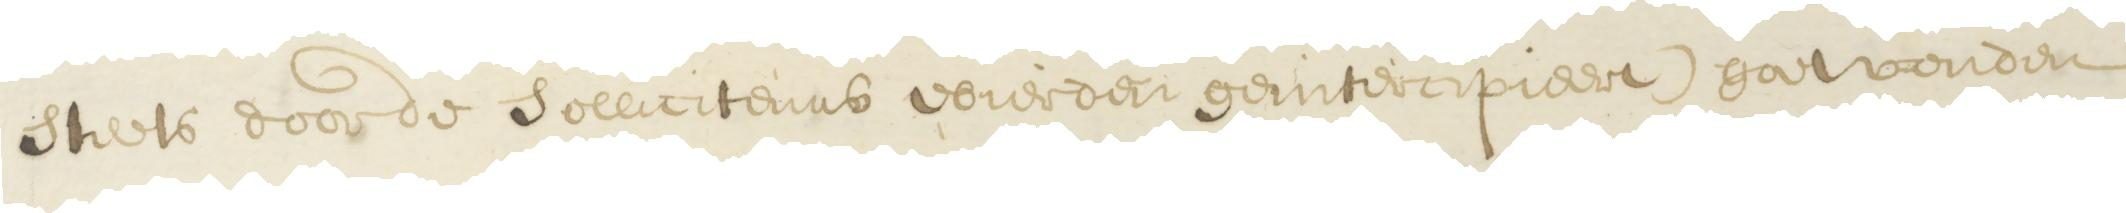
steets door de solliciteurs wierden geintercipieert) goetvonden
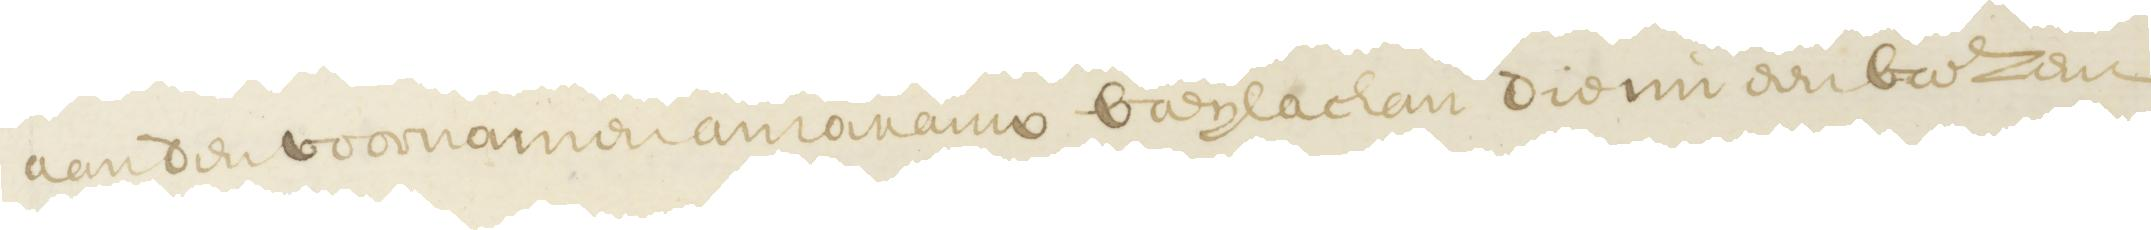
aan den voornamen amarauw breijlachan die nu een boezem
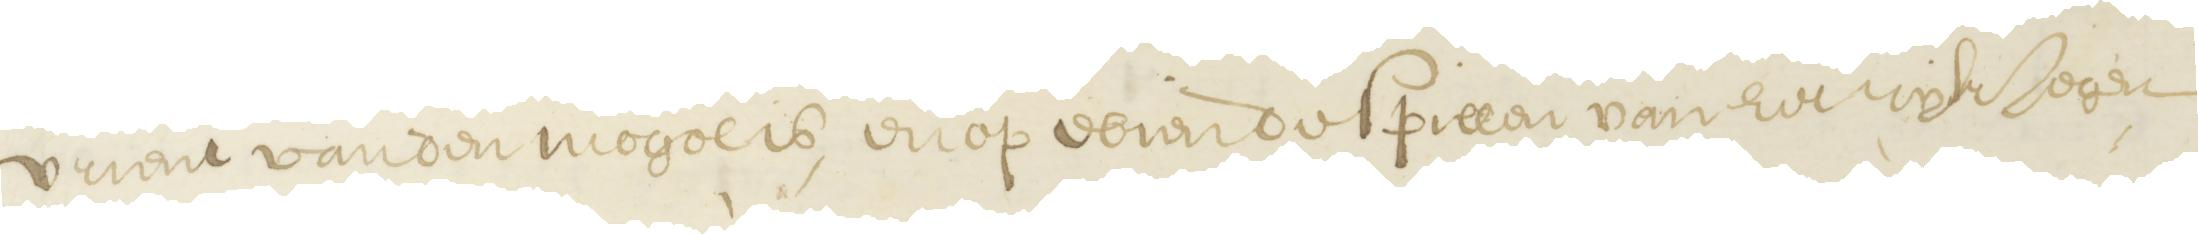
vrient van den mogol is, en op wien de spillen van het rijk Jegen
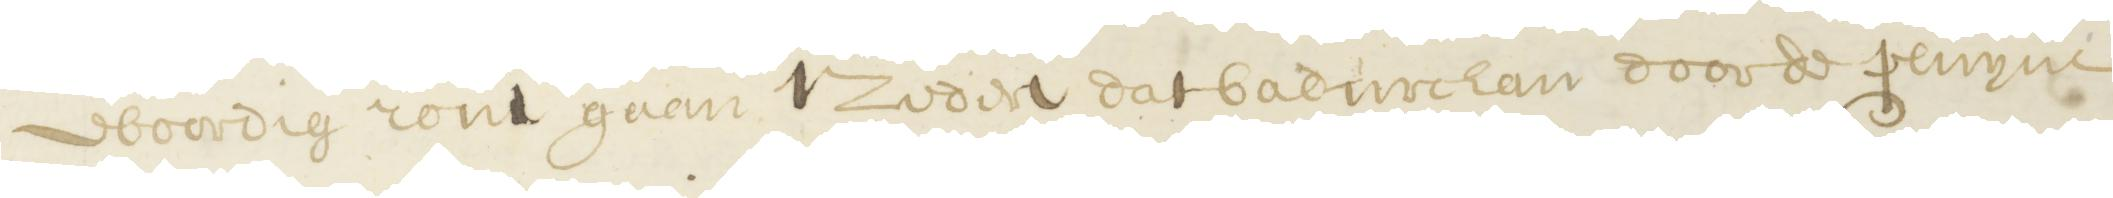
woordig ront gaan 't zedert dat badurchan door de pluijm
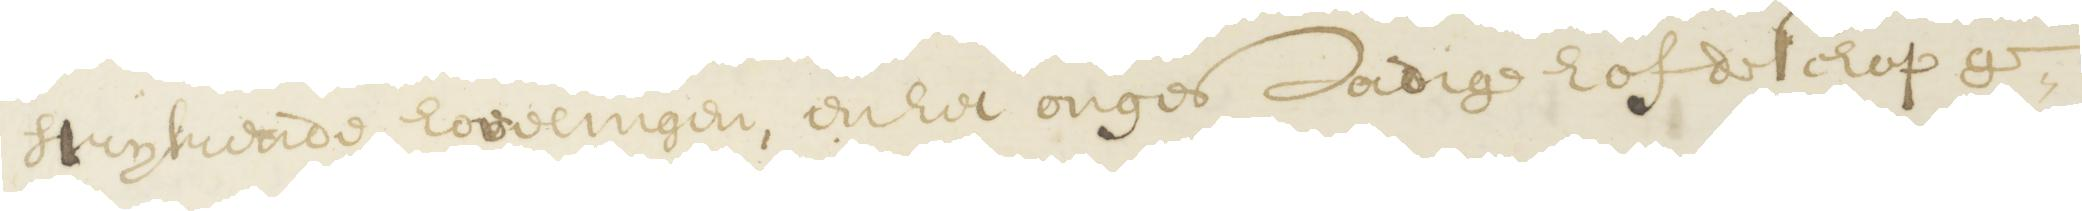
strijkende hovelingen, en het ongestadige hof de schop ge„
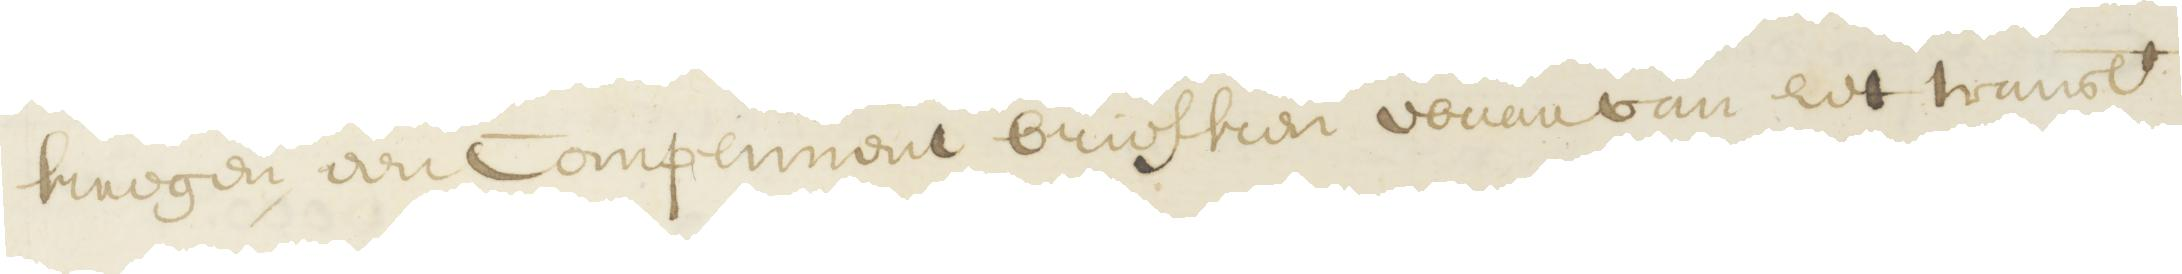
kregen, een Compliment briefken waar van het translt
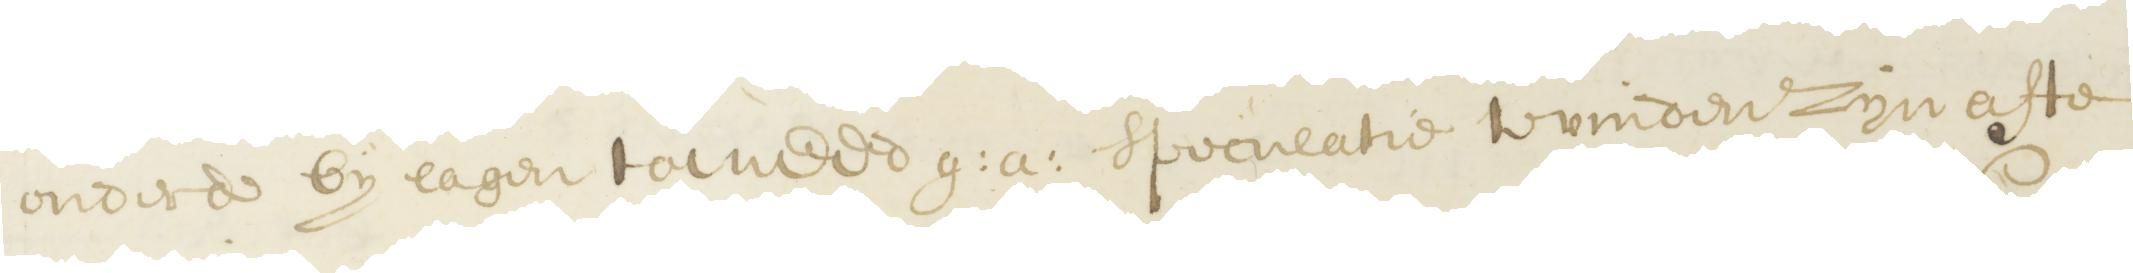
onder de bij lagen tot uEEd g: a: speculatie tevinden zijn afte
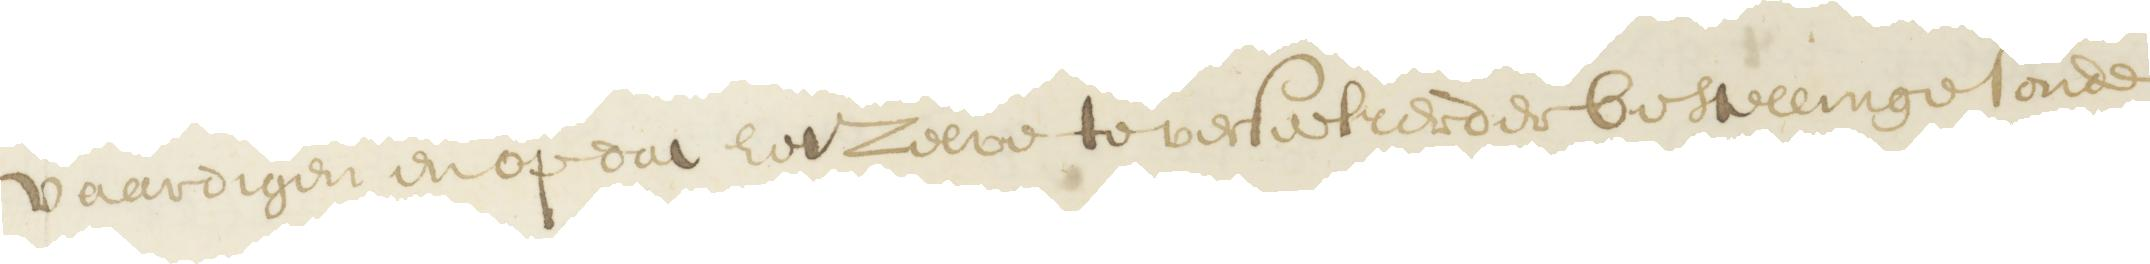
vaardigen en op dat het zelve te verseekerder bestellinge soude
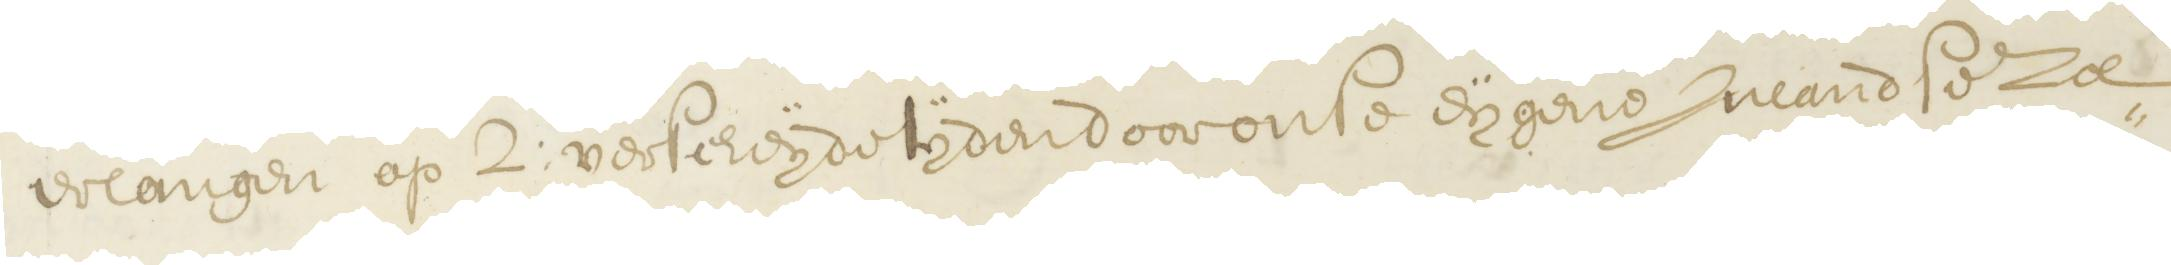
erlangen op 2: verscheijde tijden door onse eijgene Jnlandse zol„
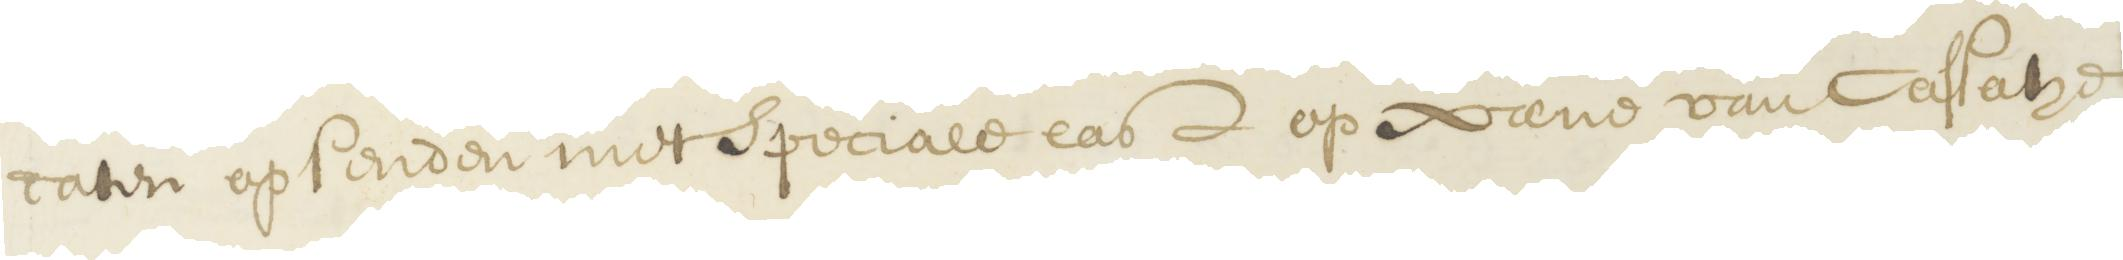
daten opsenden met speciale last op paene van cassatje
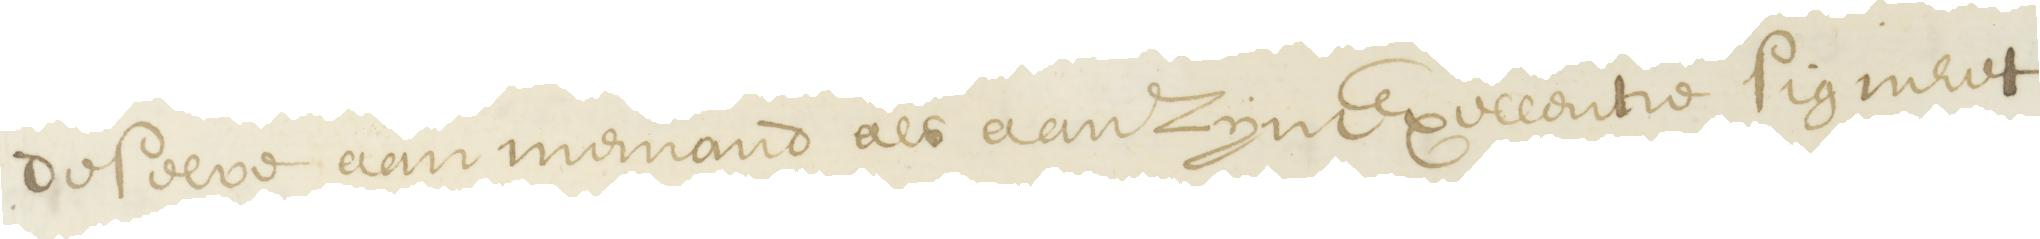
deselve aan niemand als aan zijn Exellentie sig in het
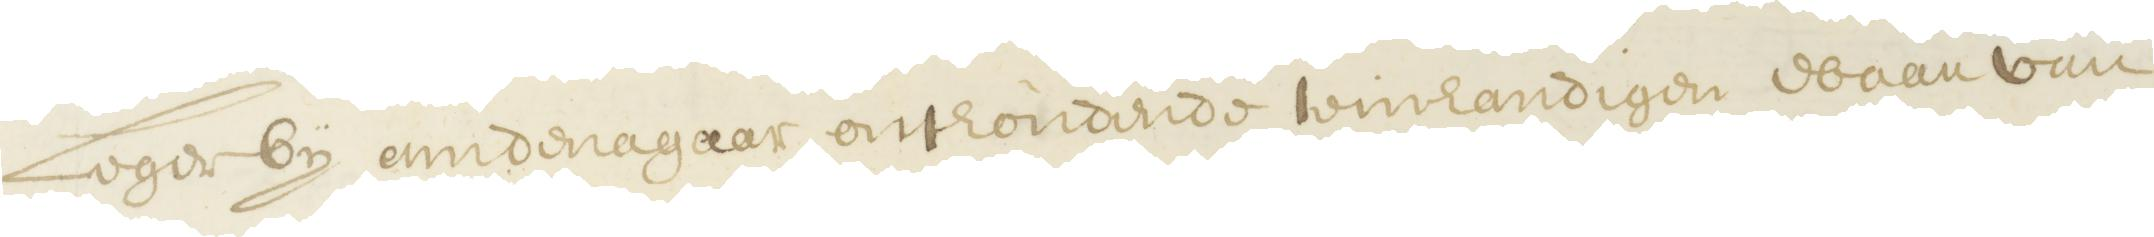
leger bij amdenagaar onthoudende teinhandigen waar van
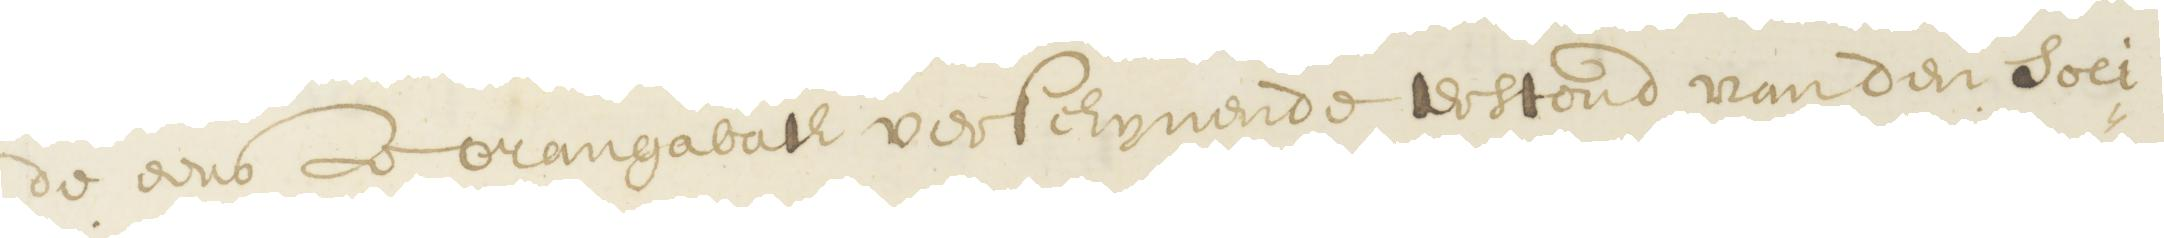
de eerste orangabath verschynende terstond van den soli„
